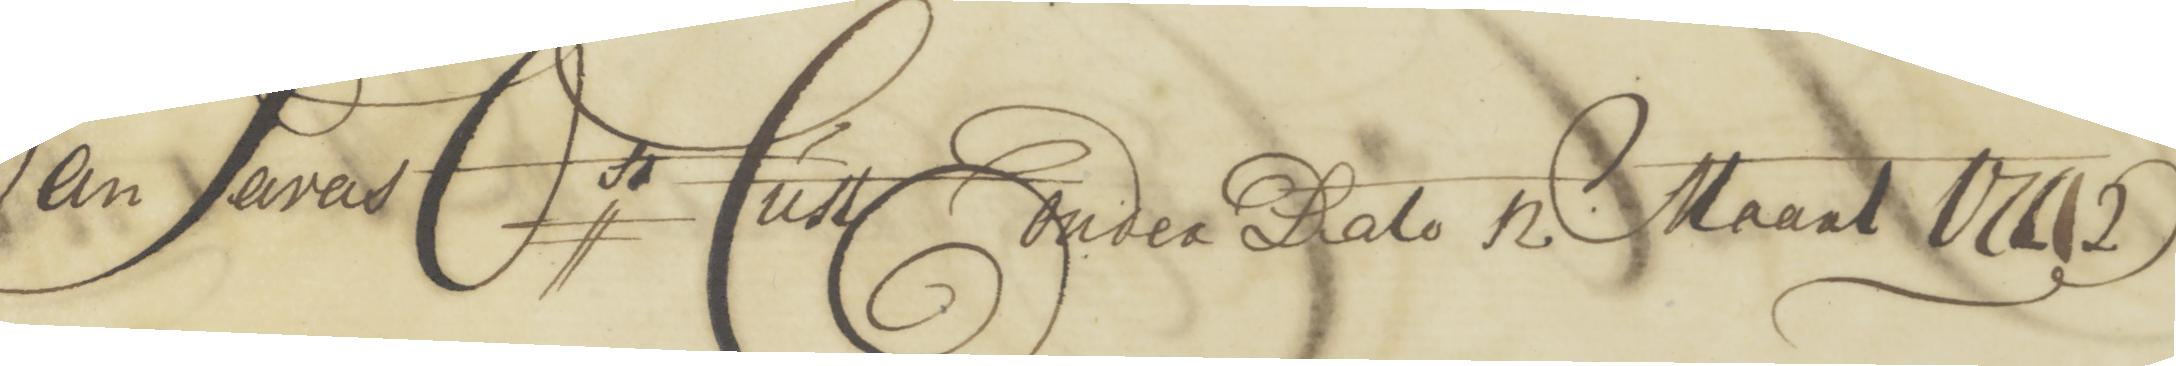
Van Javas O#st Cust onder Dato 12: Maart 1742
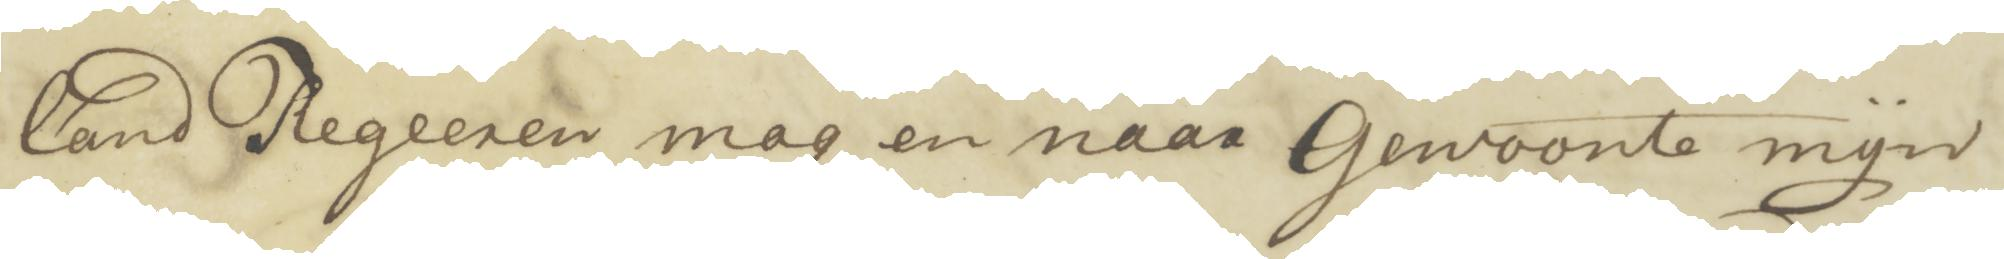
land Regeeren mag en naar gewoonte mijn
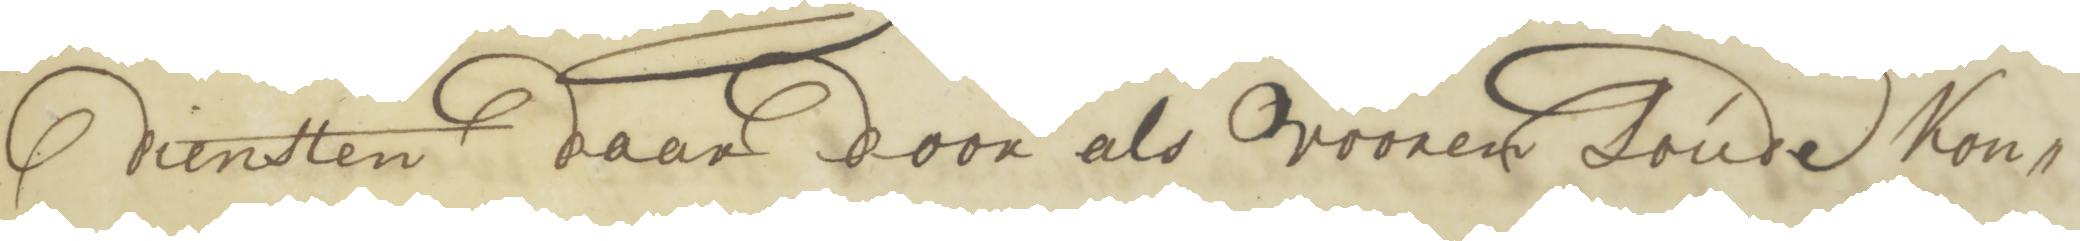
diensten daar door als vooren zoude kon„
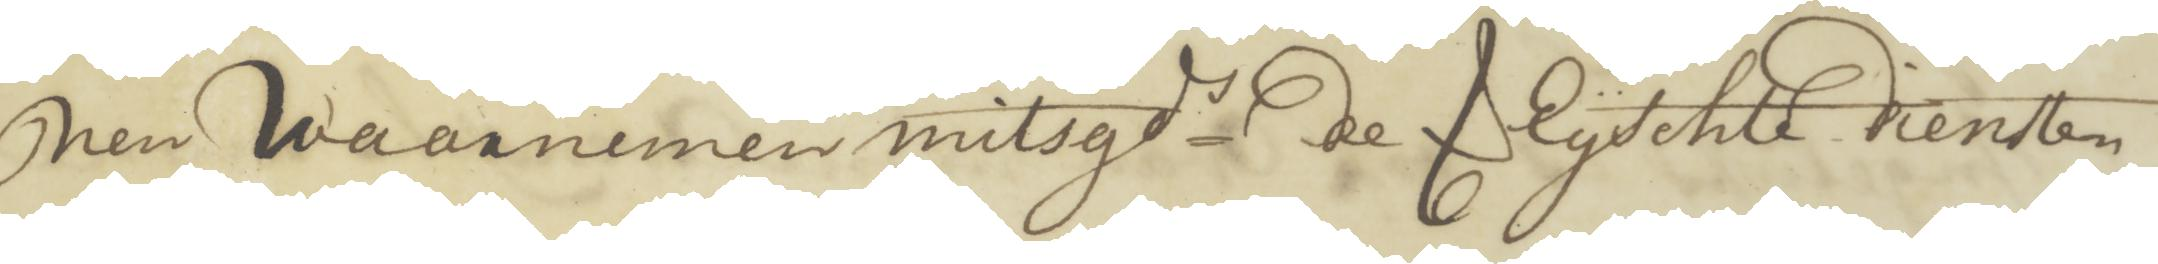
nen waarnemen mitsgd=s de verEijschte diensten
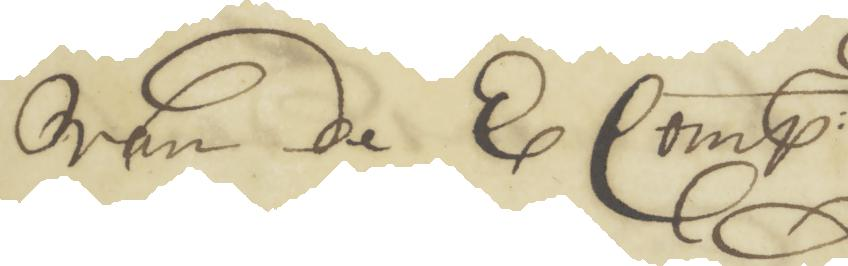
van de E Comp:
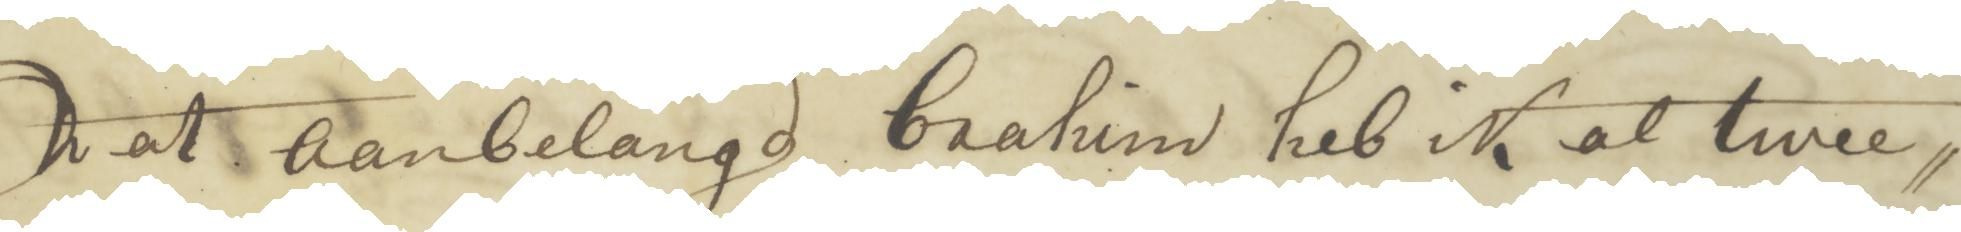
Wat aanbelangd brahim heb ik al twee„
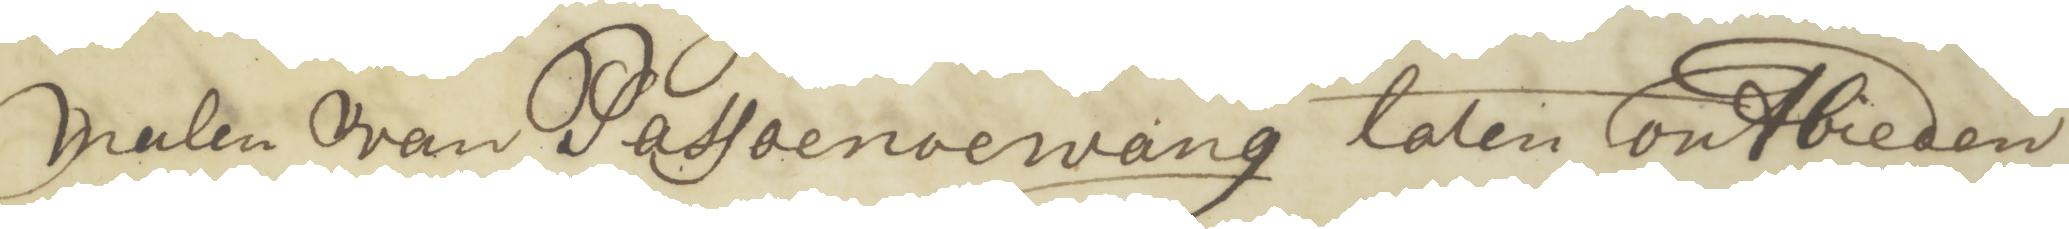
malen van Passoenoewang laten ontbieden
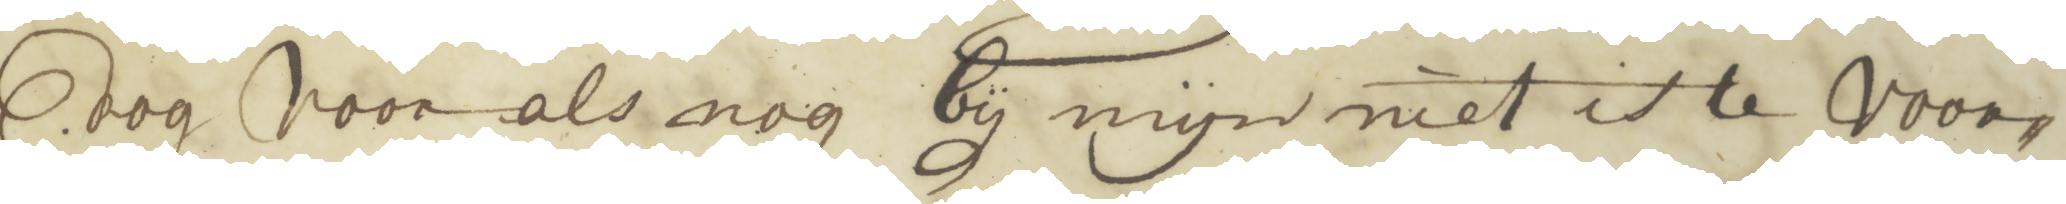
dog voor als nog bij mijn niet is te voor„
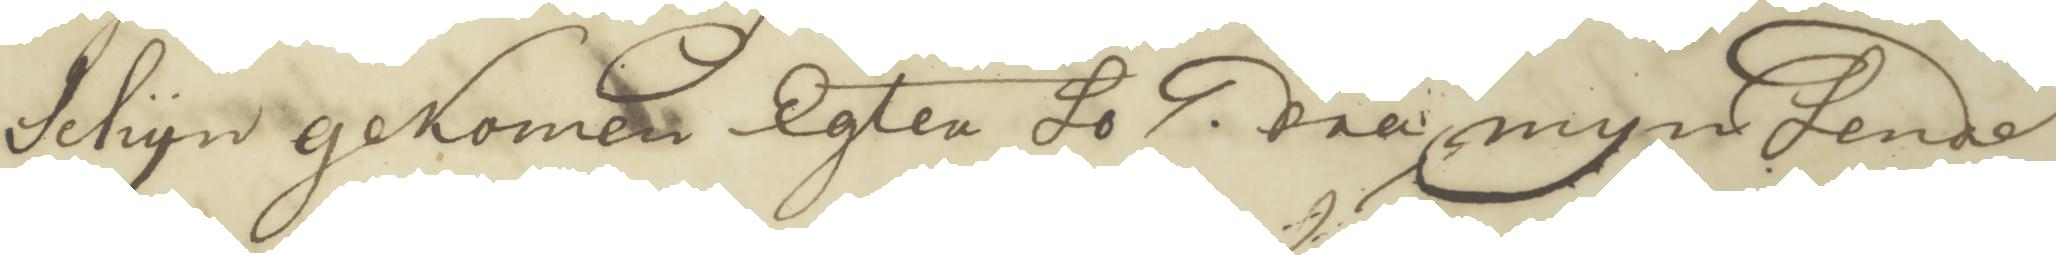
schijn gekomen Egter zo dra mijn Zende
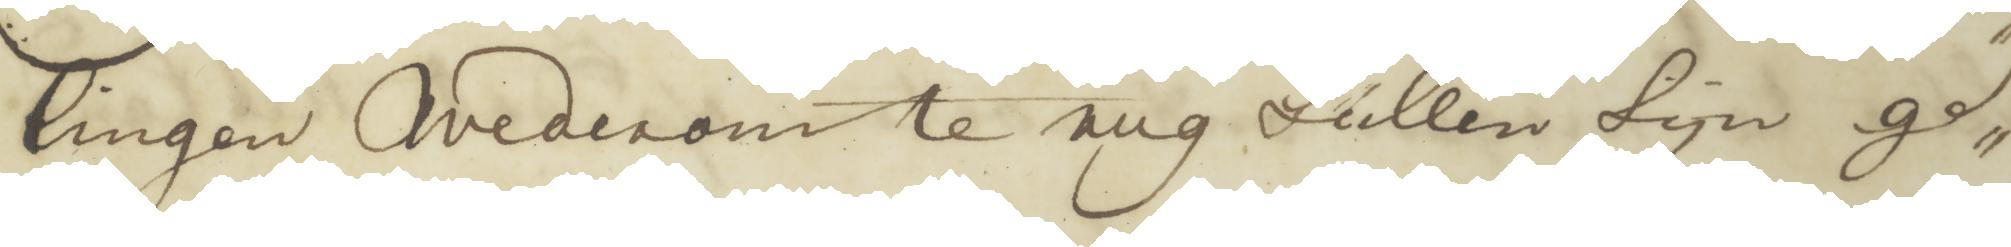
lingen wederom te rug zullen sijn ge„
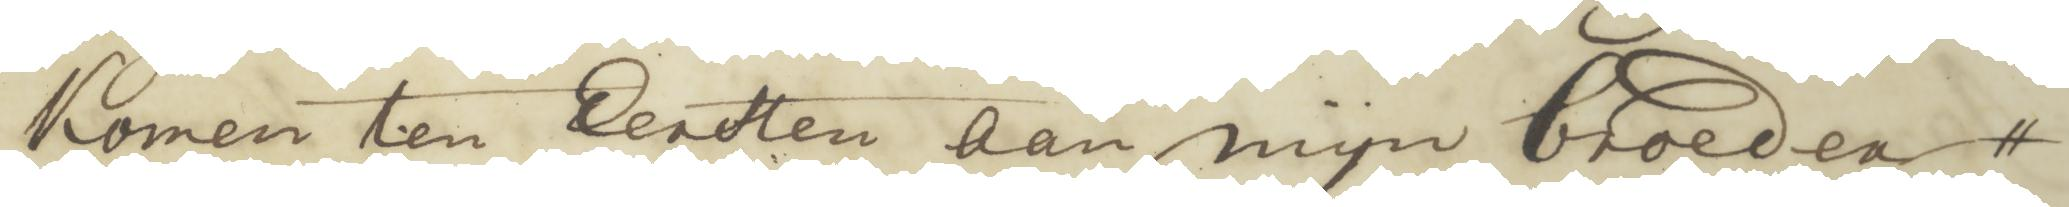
komen ten Eersten aan mijn broeder #
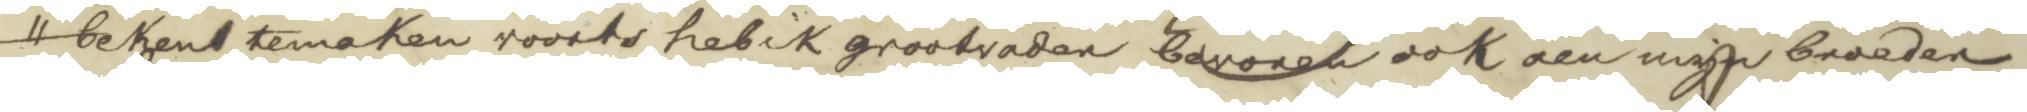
# bekent temaken voorts heb ik grootvader bevoren ook aen mijn broeder
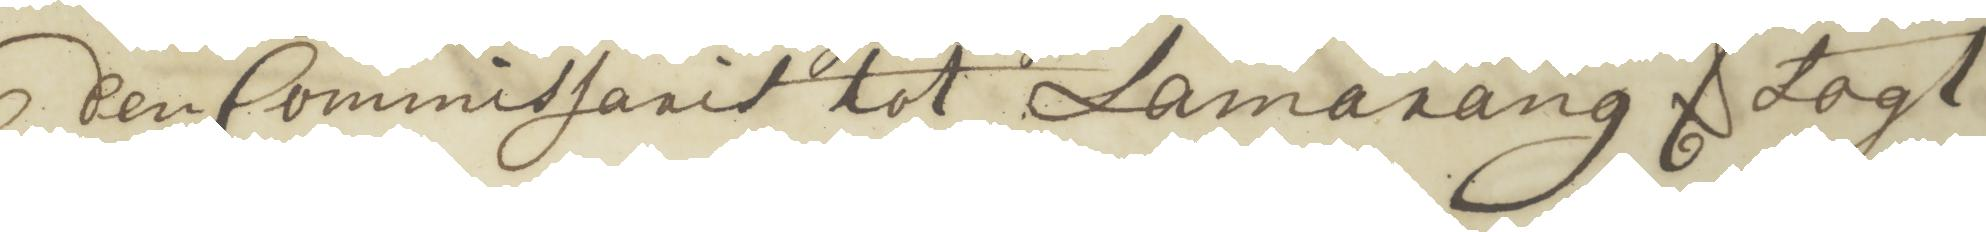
den Commissaris tot samarang versogt
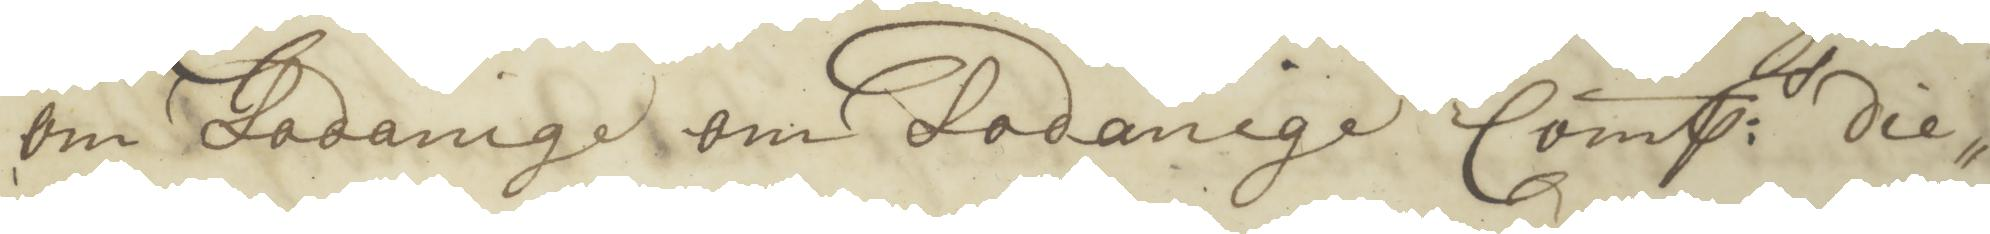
, om sodanige om sodanige Comp:s die„
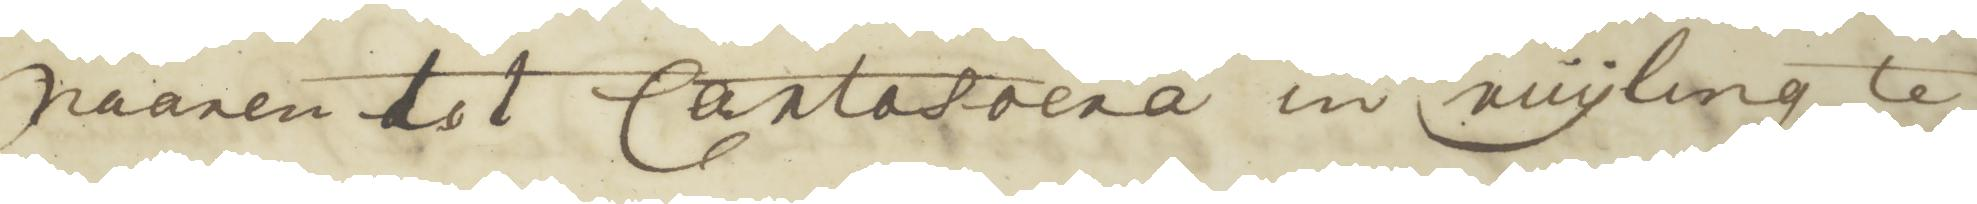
naaren tot Cartasoera in ruijling te
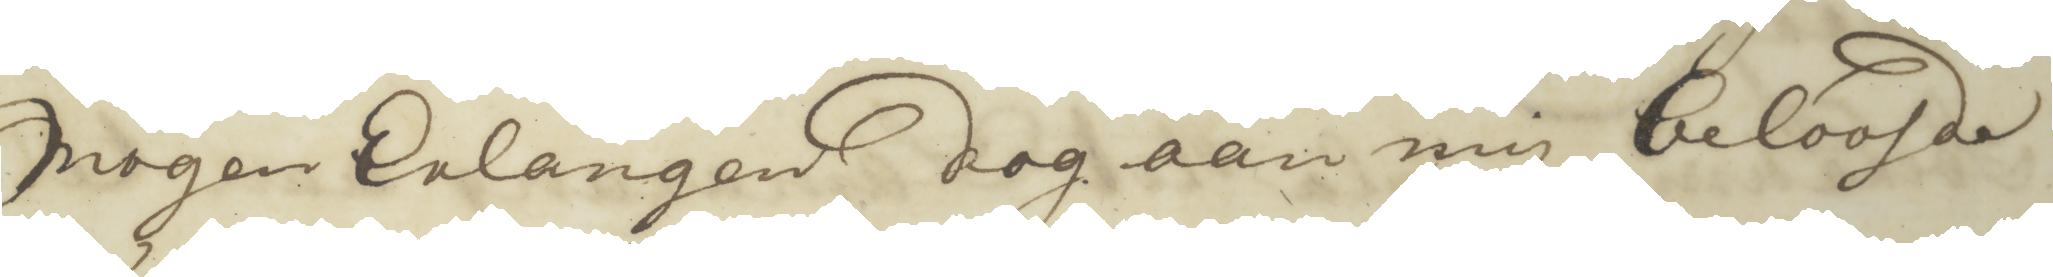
mogen Erlangen dog aan mij beloofde
